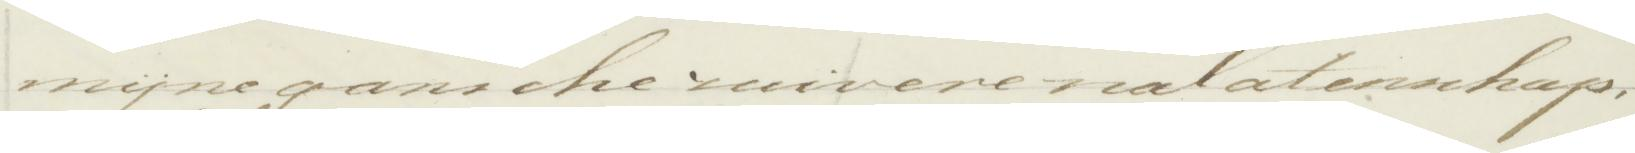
mijne gansche zuivere nalatenschap,
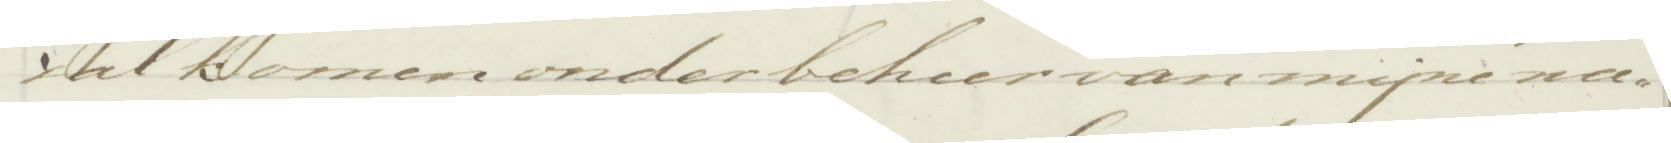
zal komen onder beheer van mijne na„
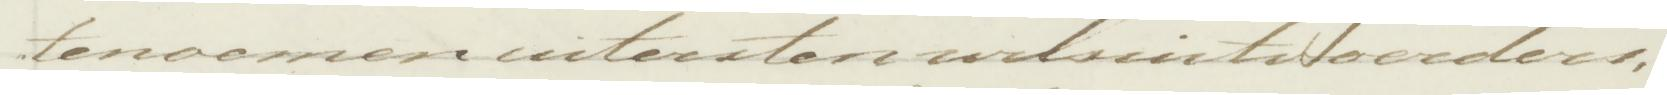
„tenoemen uitersten wilsuitvoerders,
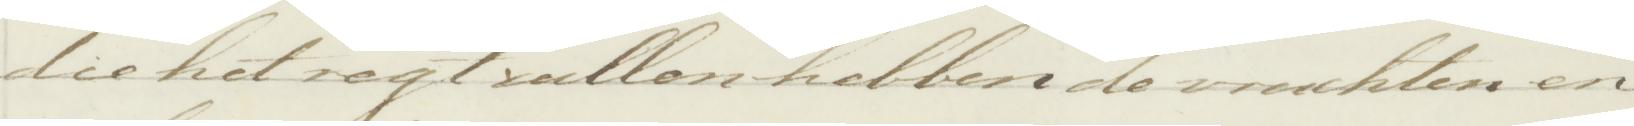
die het regt zullen hebben de vruchten en
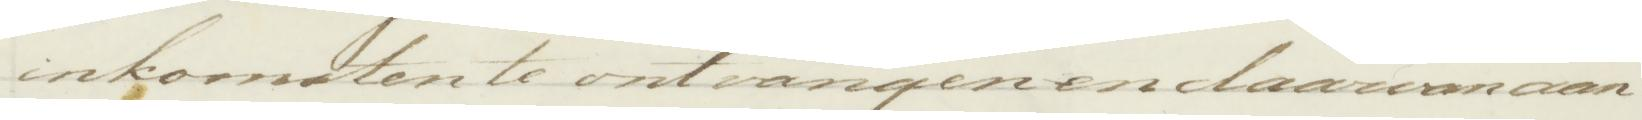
inkomsten te ontvangen en daarvan aan
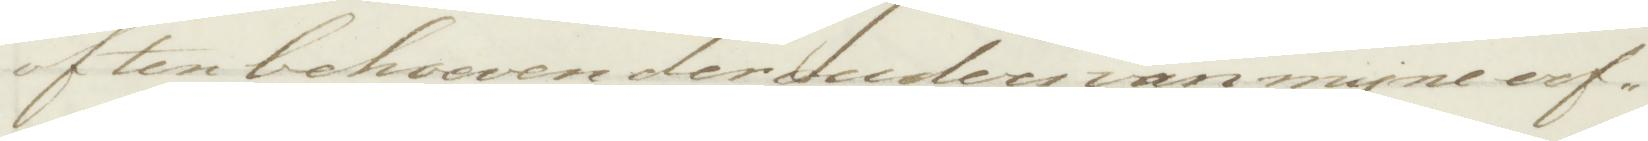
of ten behoeven der ouders van mijne erf„
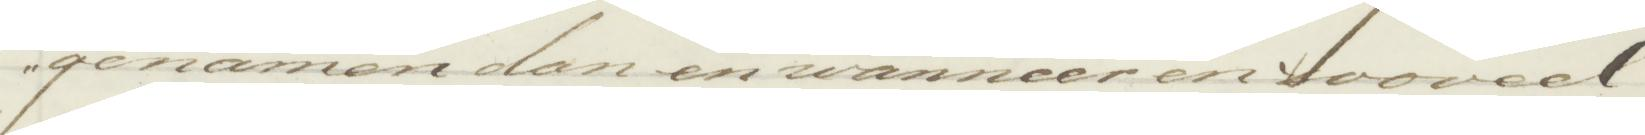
„genamen dan en wanneer en zooveel
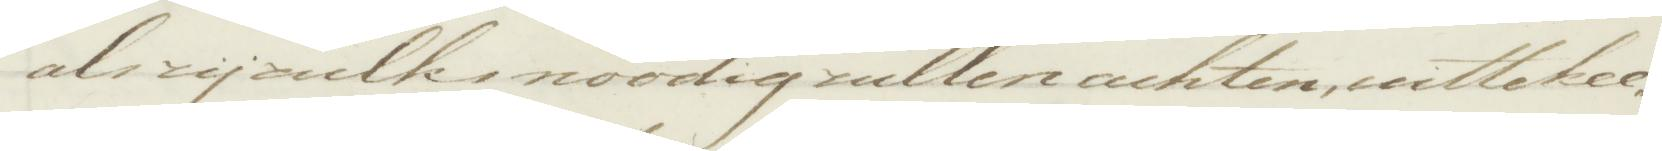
als zij zulks noodig zullen achten, uittekee„
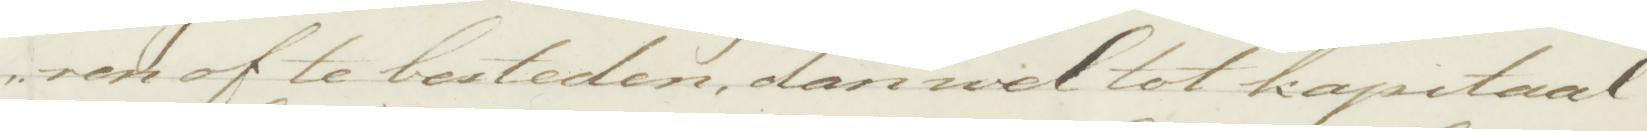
„ren of te besteden, dan wel tot kapitaal
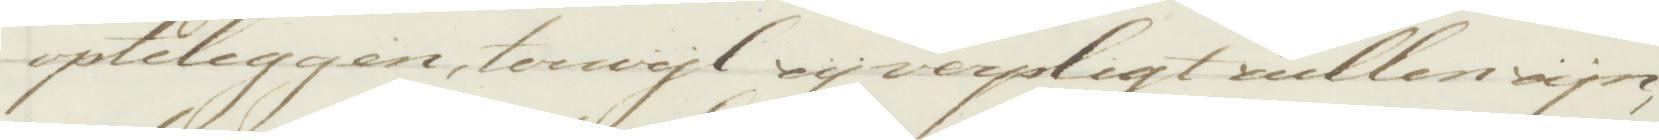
opteleggen, terwijl zij verpligt zullen zijn,
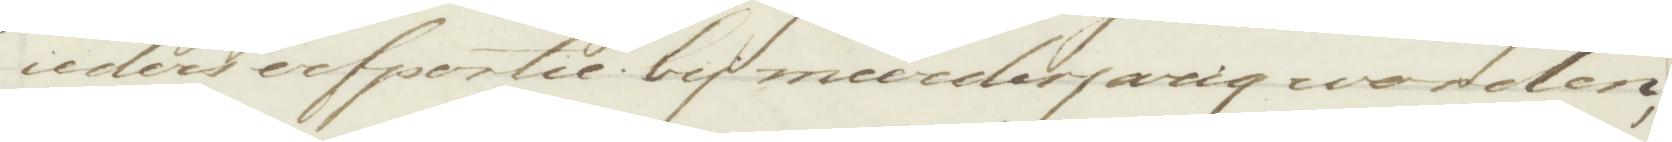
ieders erfportie bij meerderjarig worden,
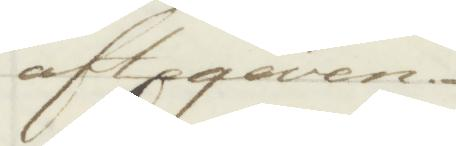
aftegeven.
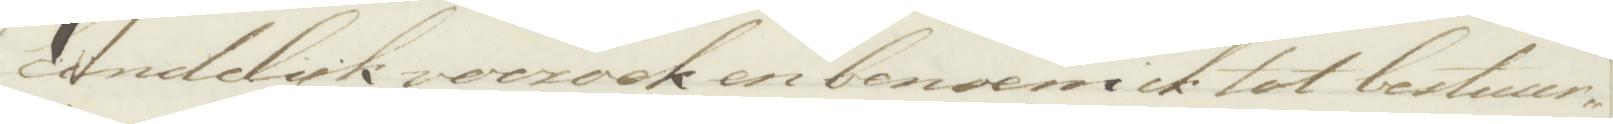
Eindelijk verzoek en benoem ik tot bestuur„
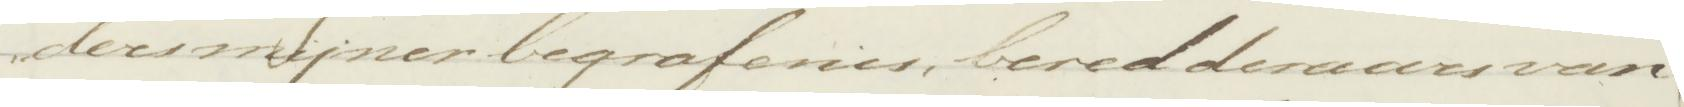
„ders mijner begrafenis, beredderaars van
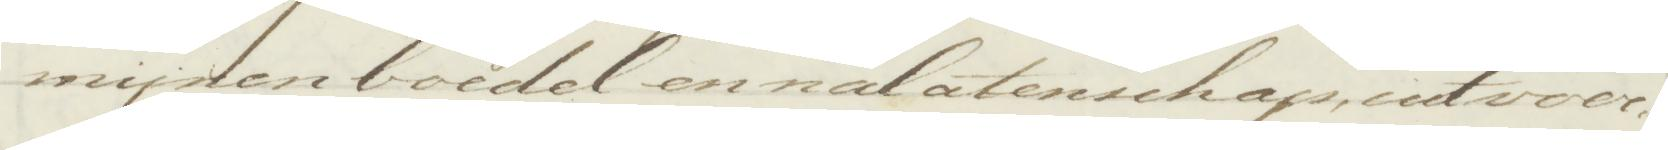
mijnen boedel en nalatenschap uit voer„
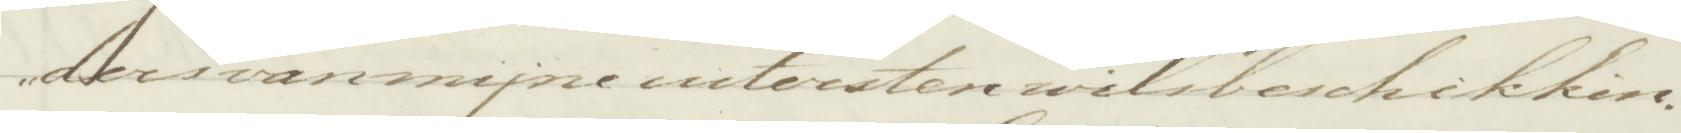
„ders van mijne uitersten wils beschikkin„
